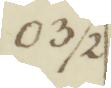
03½
